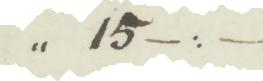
„ 15 —: —
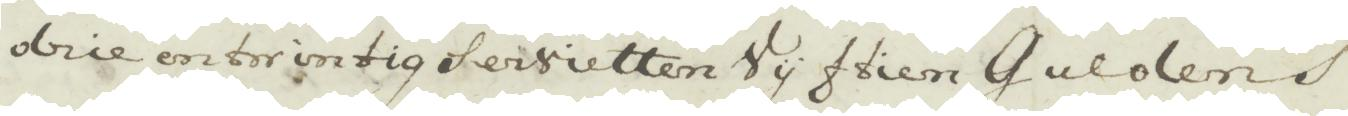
drie en twintig servietten Vijftien Guldens
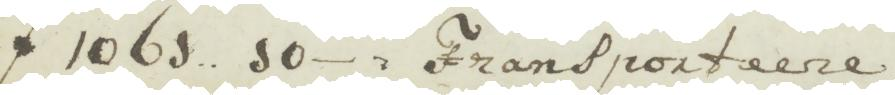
ƒ 1061..10 —: Transporteere
